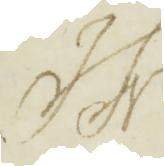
JJr
